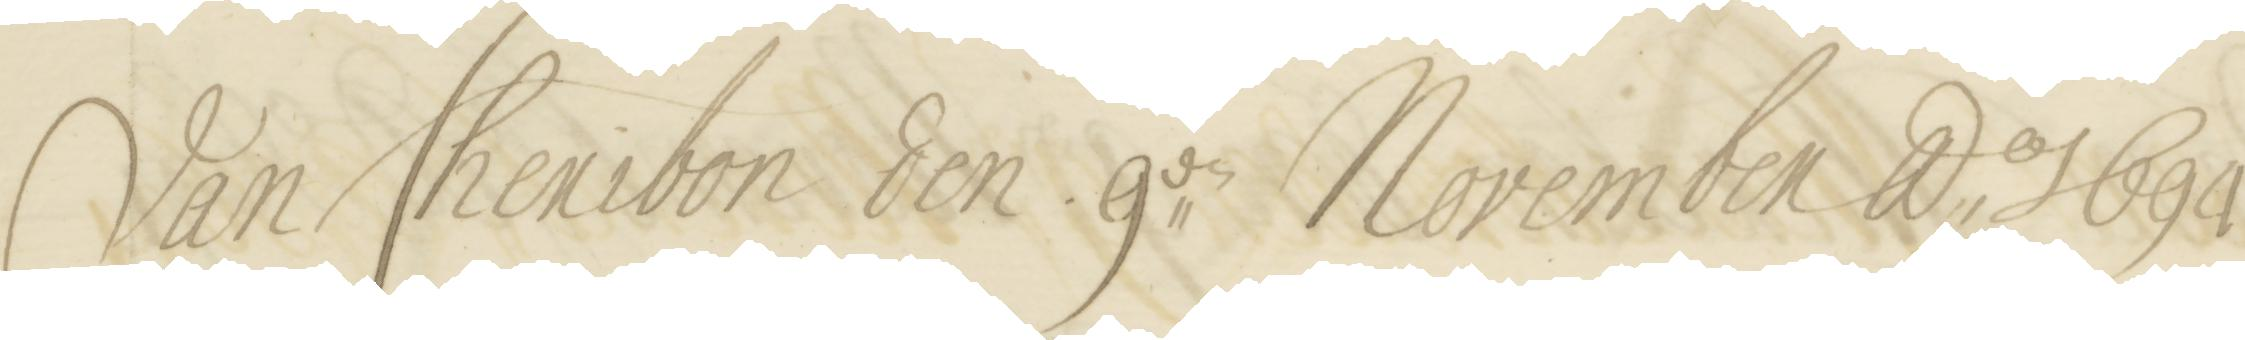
Van Cheribon den 9„en November A„o 1694
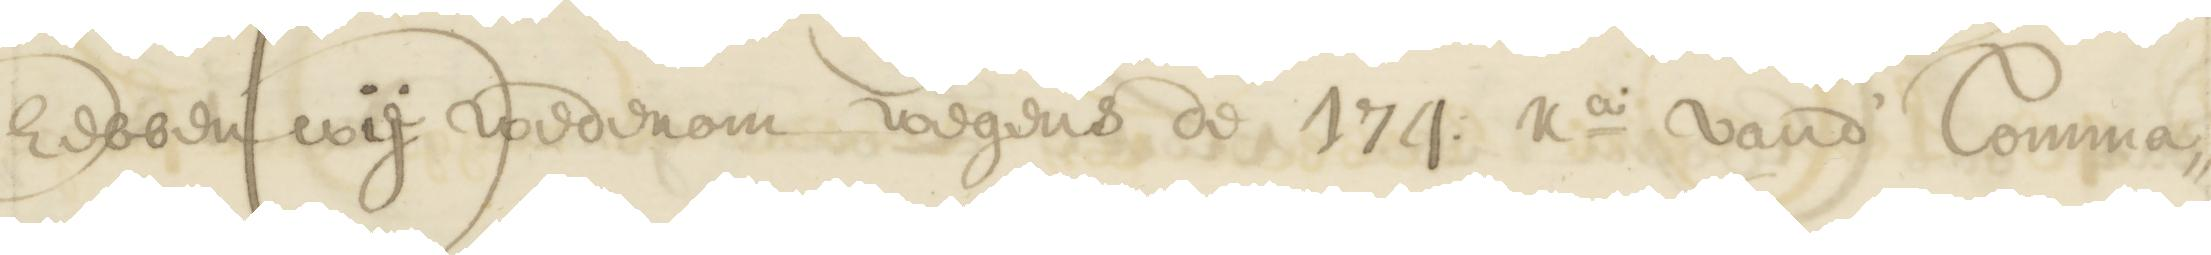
hebben wij wederom wegens de 174: r=a vand’ Tomma„
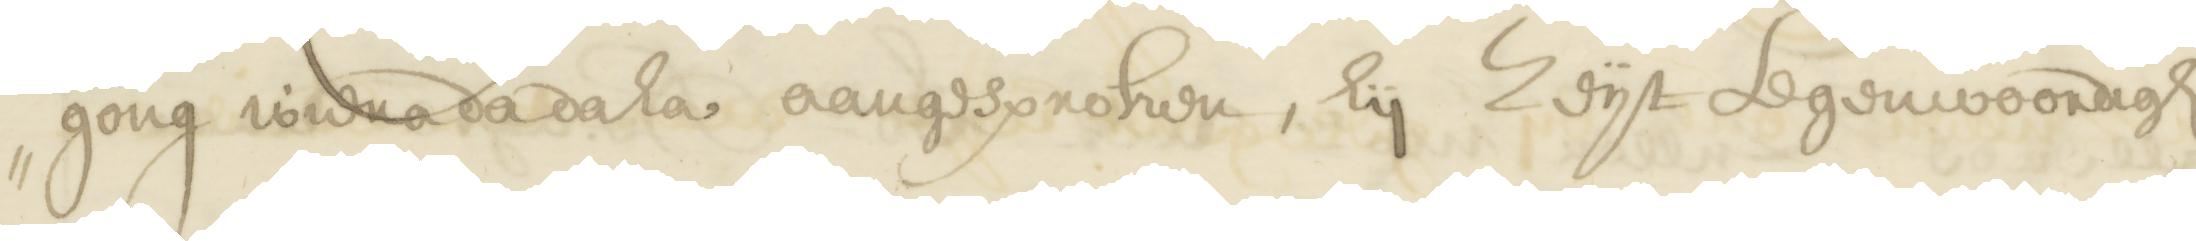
„gong wiera dadaha aangesproken, hij zeijt Tegenwoordigh
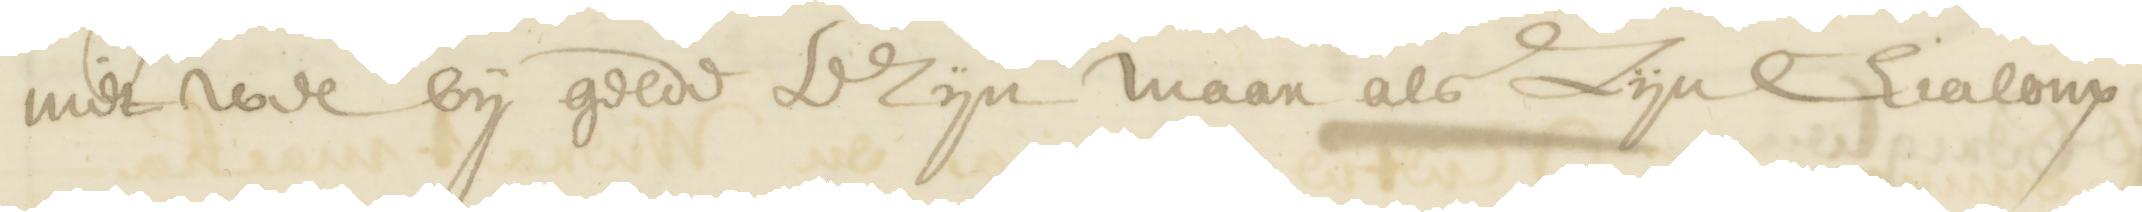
niet wel bij gelde tezijn Maar als zijn Chialoup
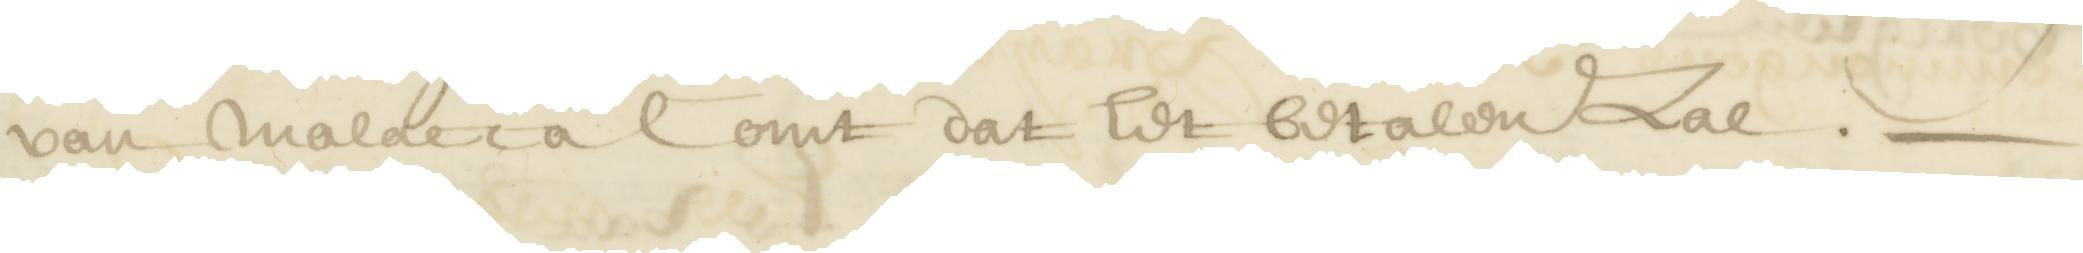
van Malacca Comt dat het betalen zal. —
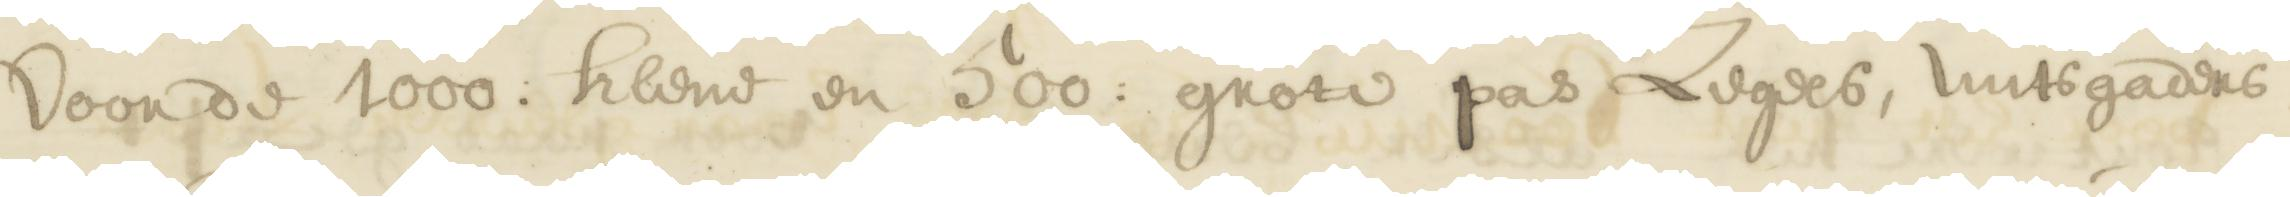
Voor de 1000: klene en 500: grote pas zegels, Mitsgaders
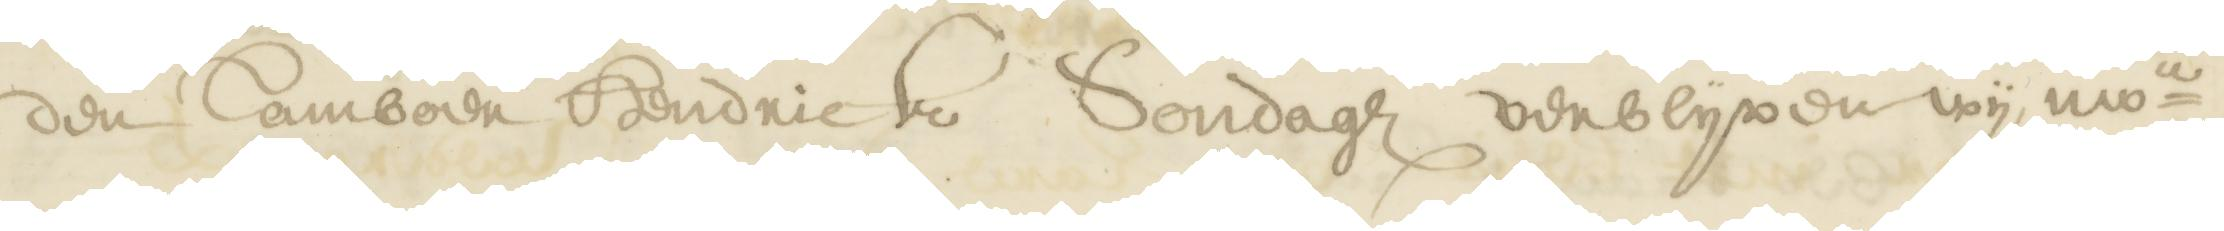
den Tamboer Hendrick Sondagh verblijven wij uw=e
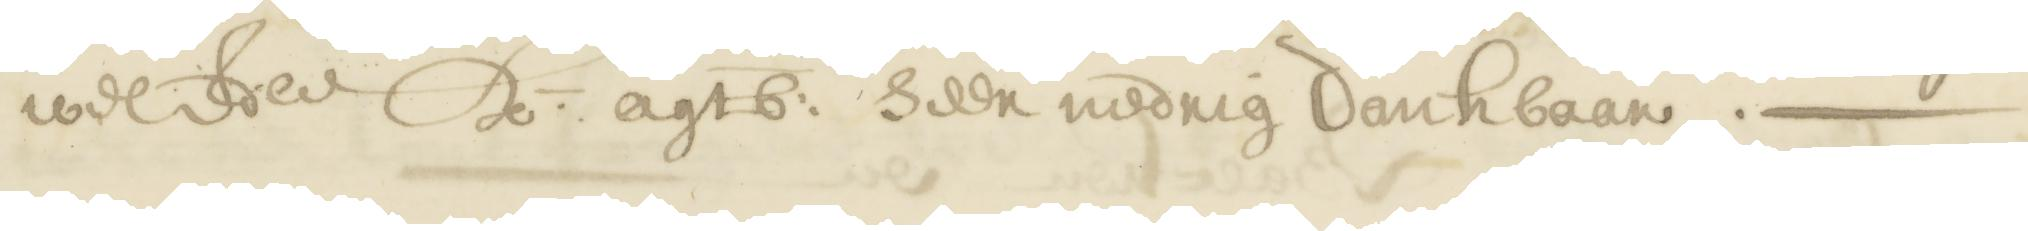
wel Edle Ho: agtb: heer nedrig dankbaar. —
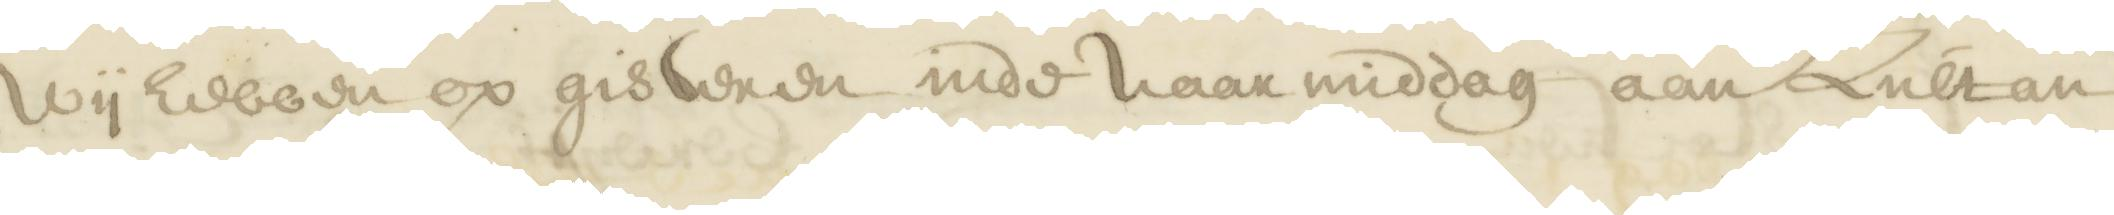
Wij hebben op gisteren inde naar middag aan Zultan
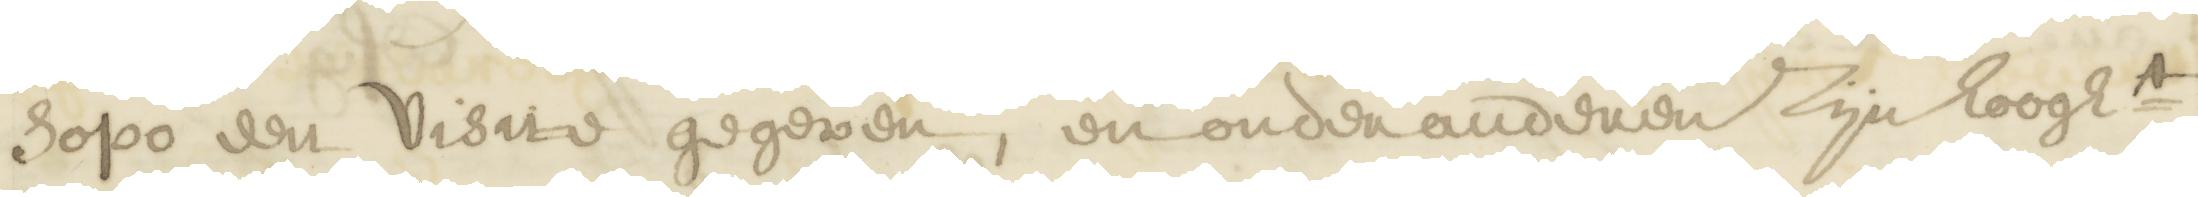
sopo een Visite gegeven, en onder anderen zijn hoogh=t
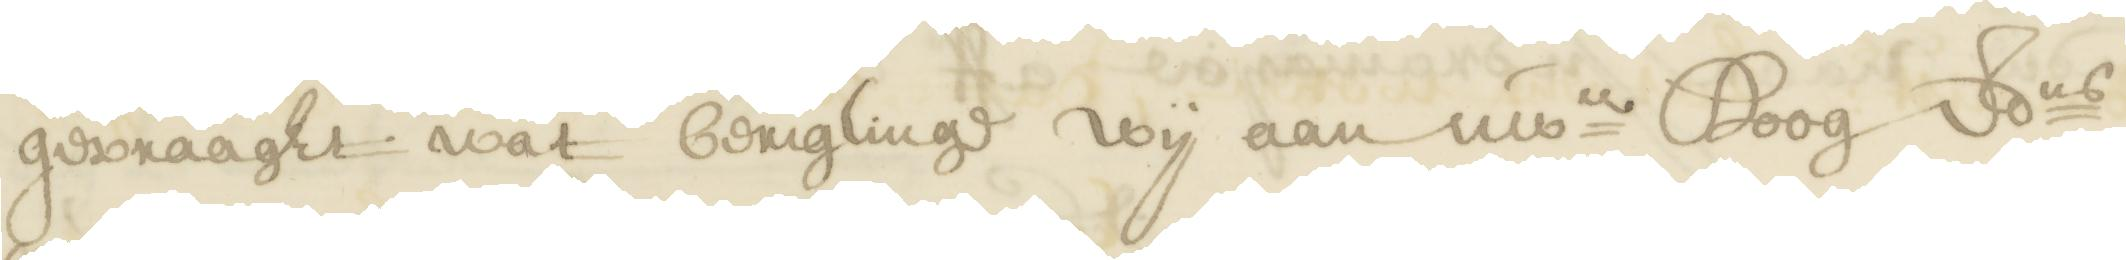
gevraaght wat berigtinge wij aan uw=e Hoog Ed=ns
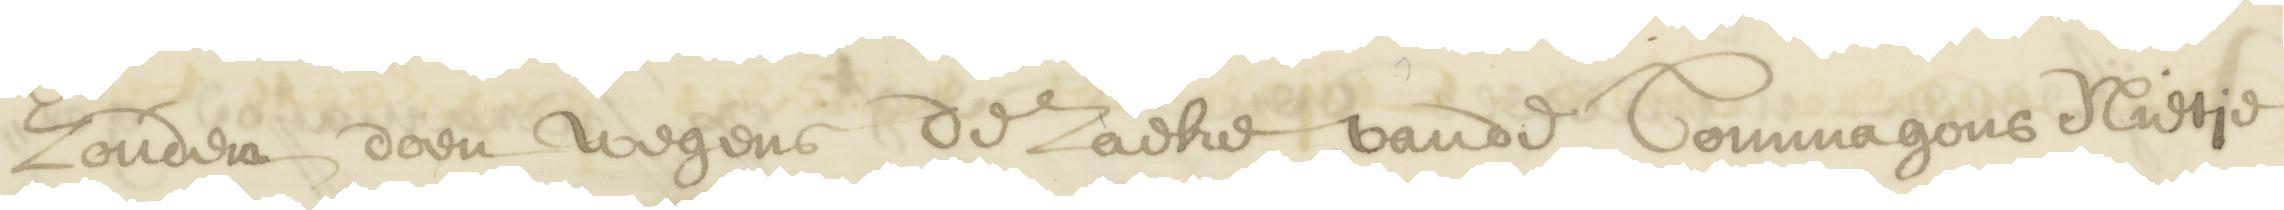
zouden doen wegens dezaeke vande Tommagons Nietje
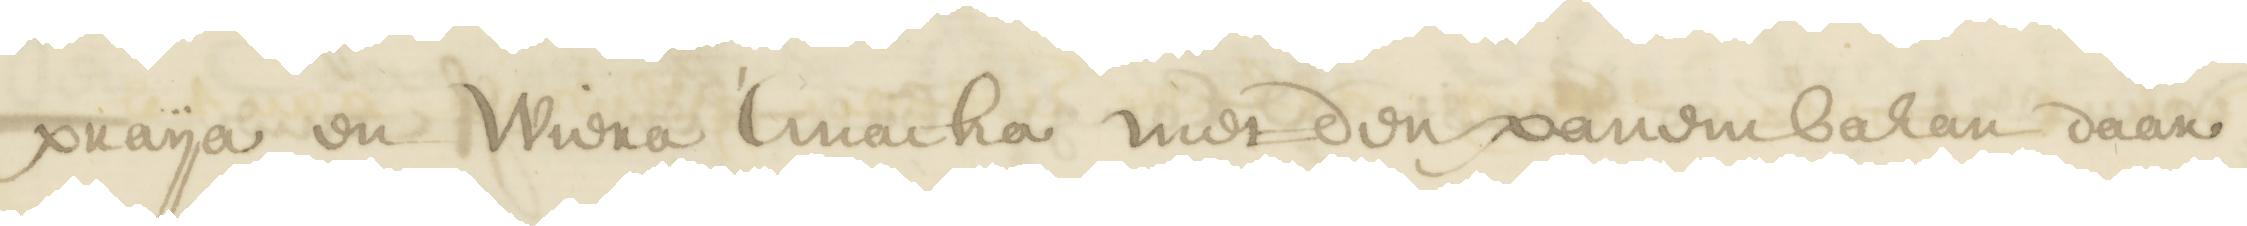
praija en Wiera 'tmacka met den panembahan daar
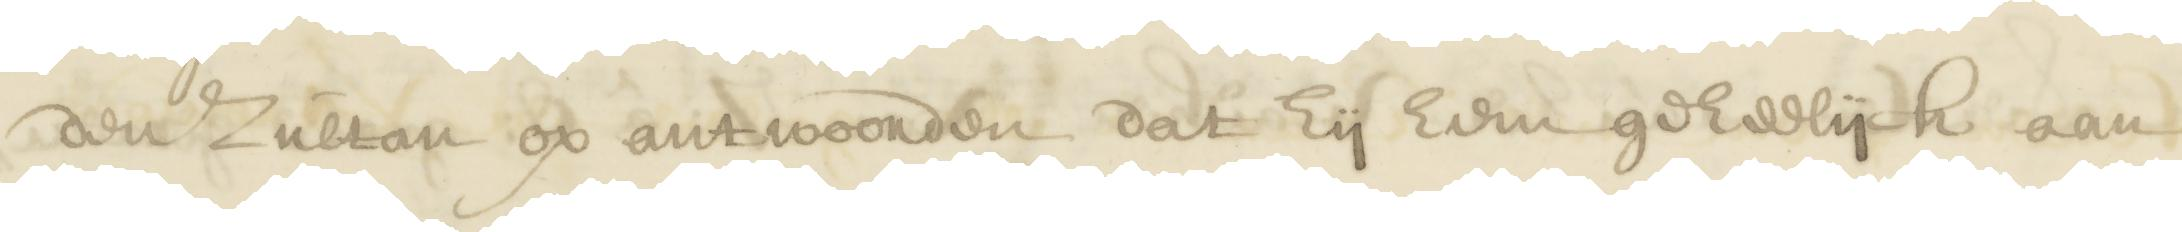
den zultan op antwoorden dat hij hem geheelijck aan
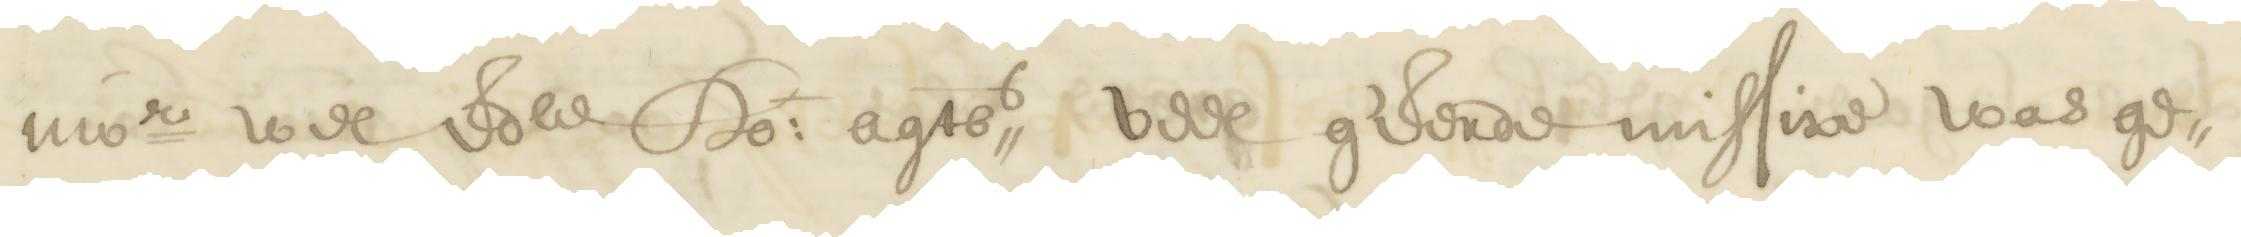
uw=er wel Edle Ho: agtb„s veel g’Eerde missive was ge„
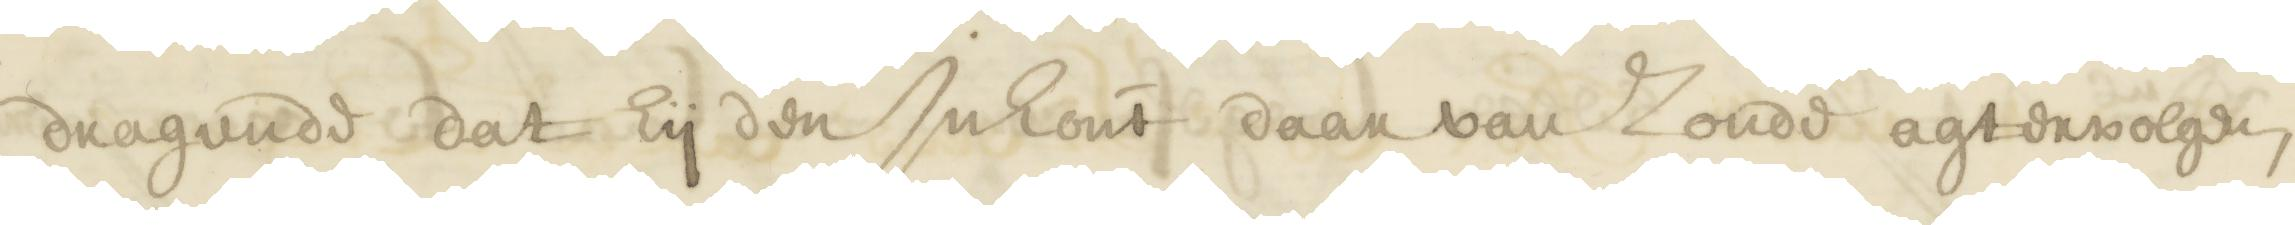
dragende dat hij den Jnhout daar van zoude agtervolgen,
